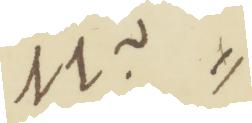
11.' „
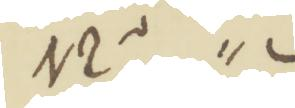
12.' „
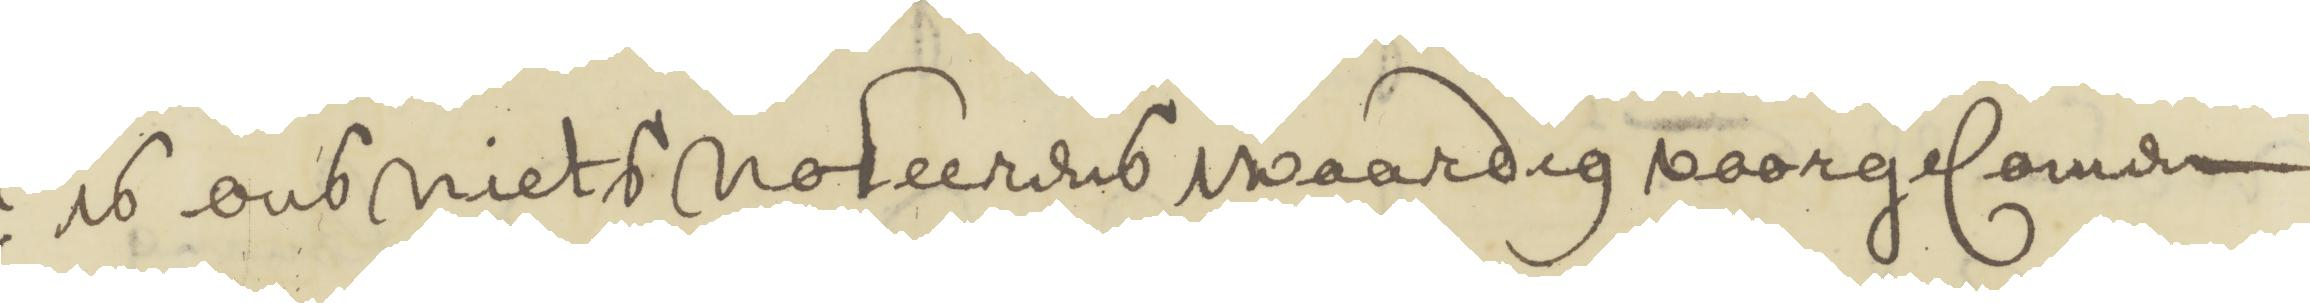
is ons niets noteerens waardig voorgecomen
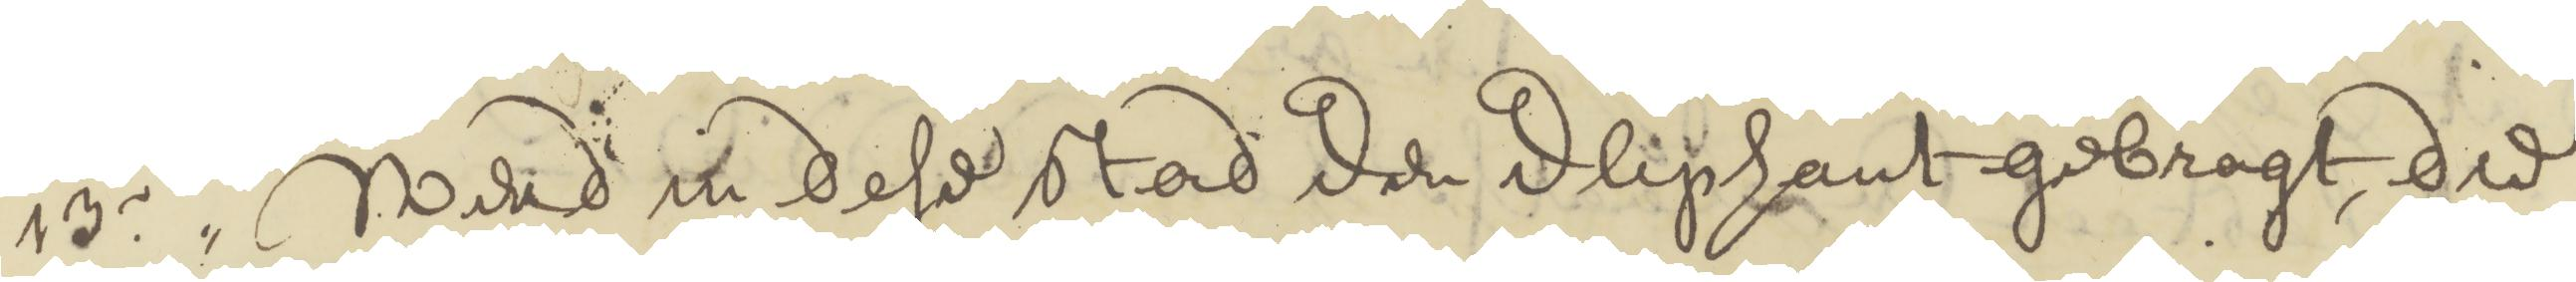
13.' „ werd in dese stad Een Eliphant gebragt, die
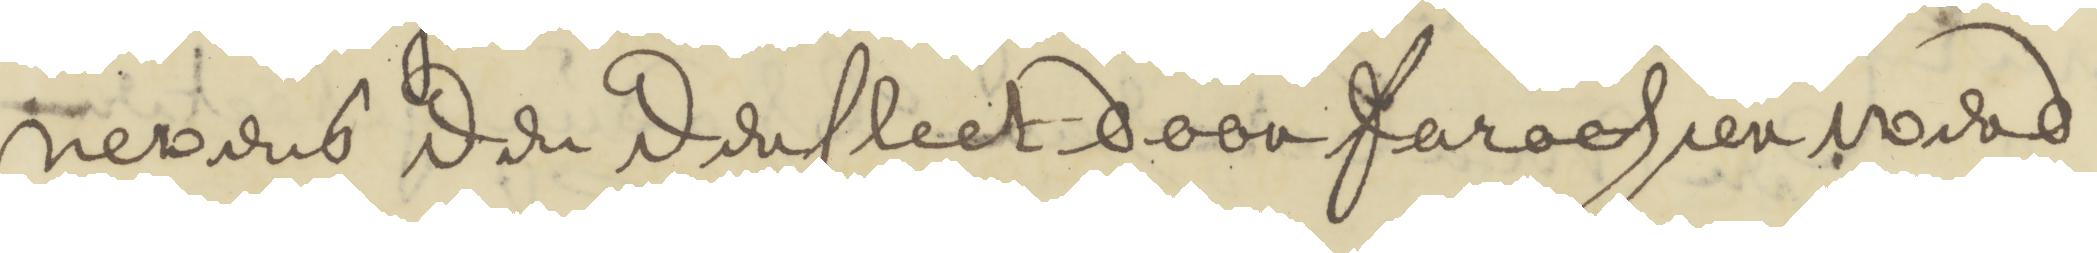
nevens Een EerCleet door farochier werd
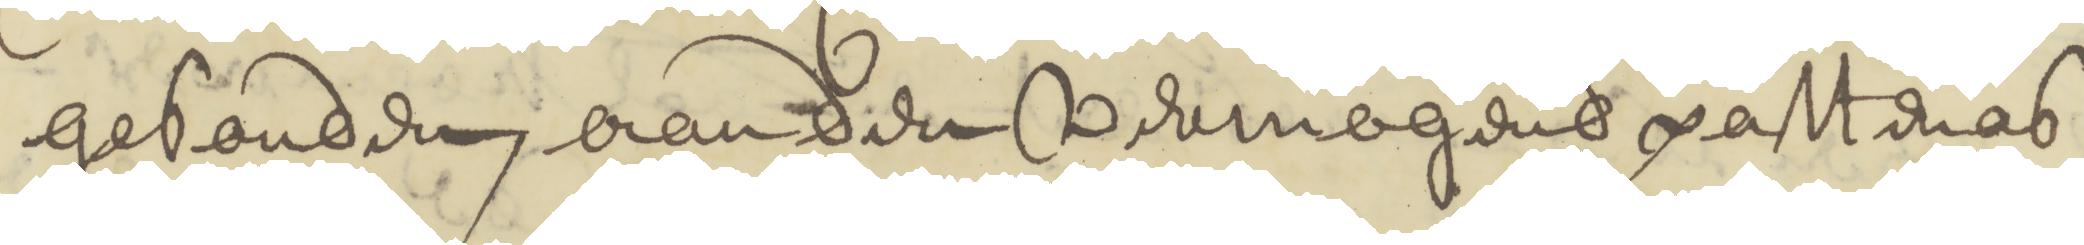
gesonden aan den vermogend pattenas
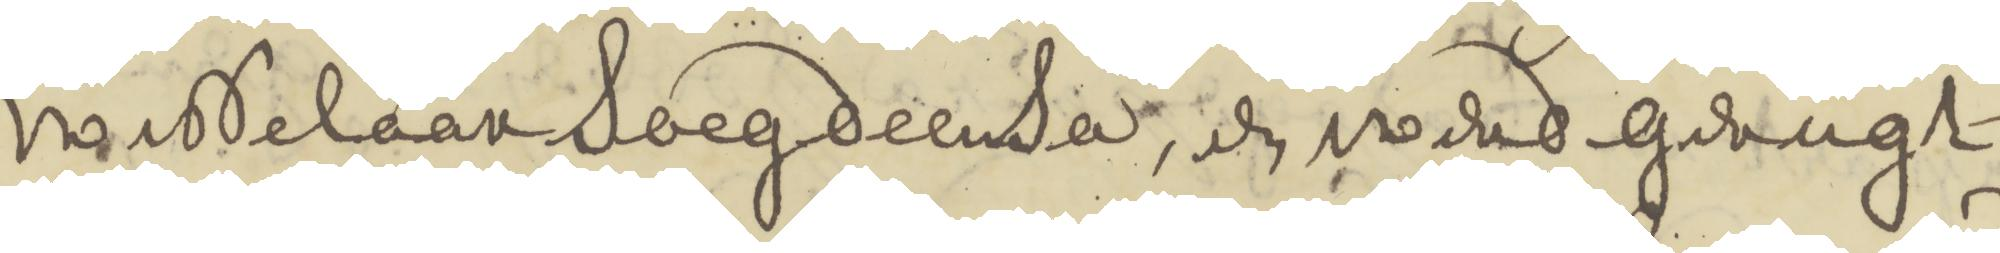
wisselaar Soegdeensa, en werd gerugt
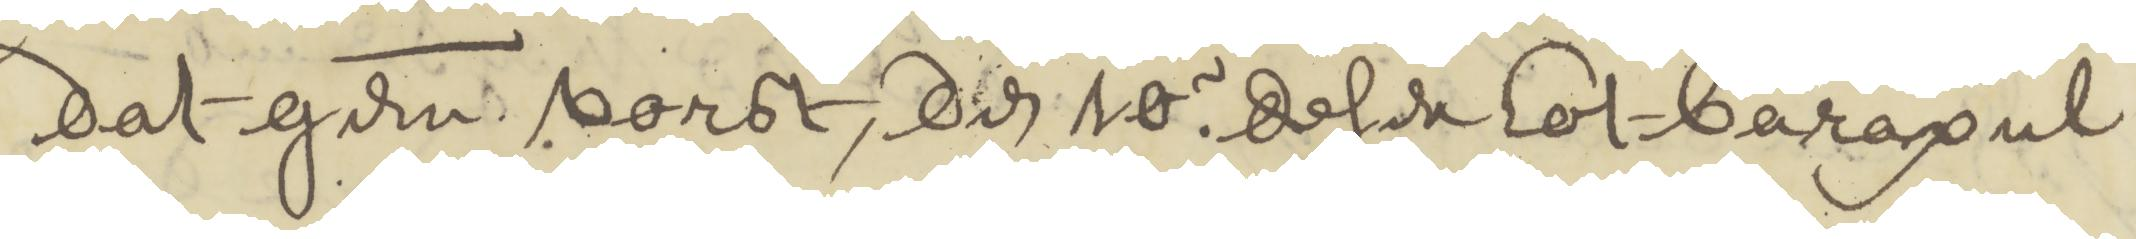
dat gem. vorst, den 10.' deser tot barapul
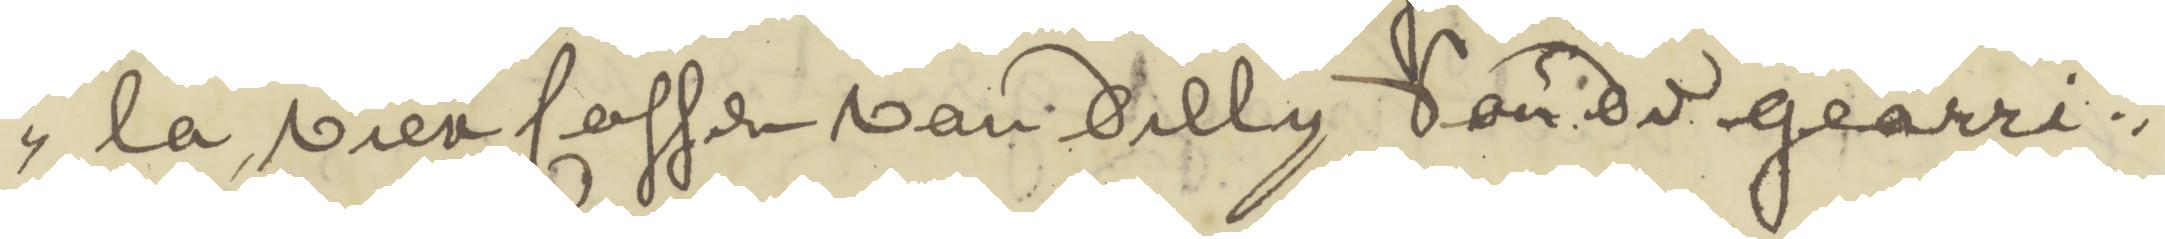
„la, vier Cosser van dillij soude gearri„
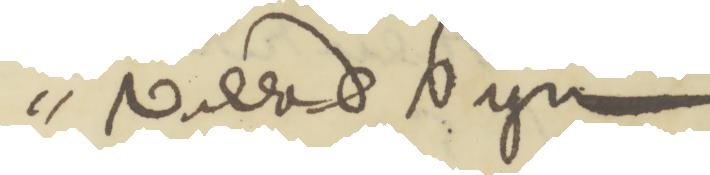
„veerd sijn
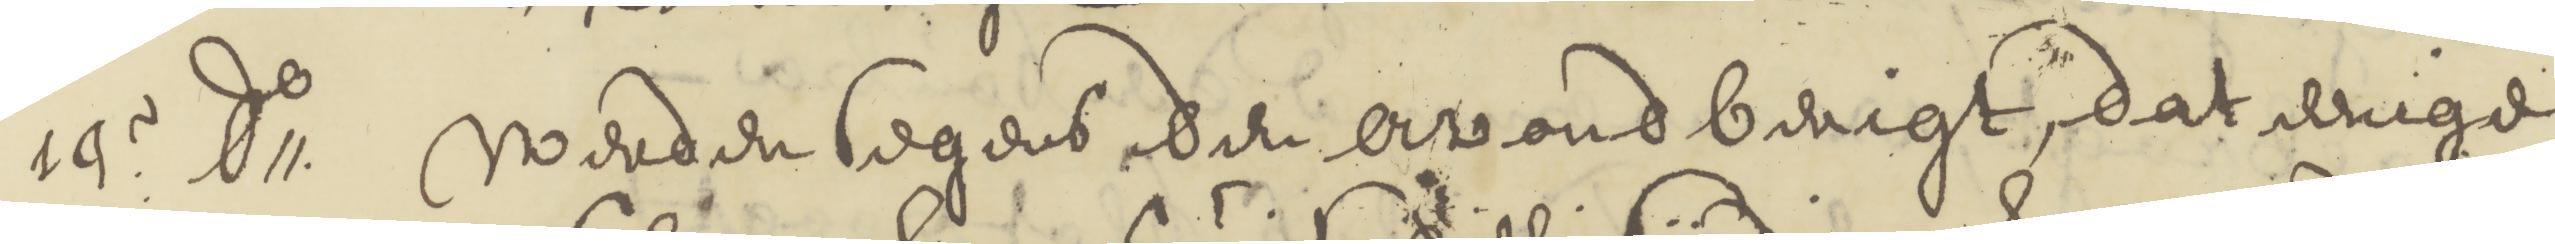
19:' d„o werden tegens den avond berigt, dat eenige
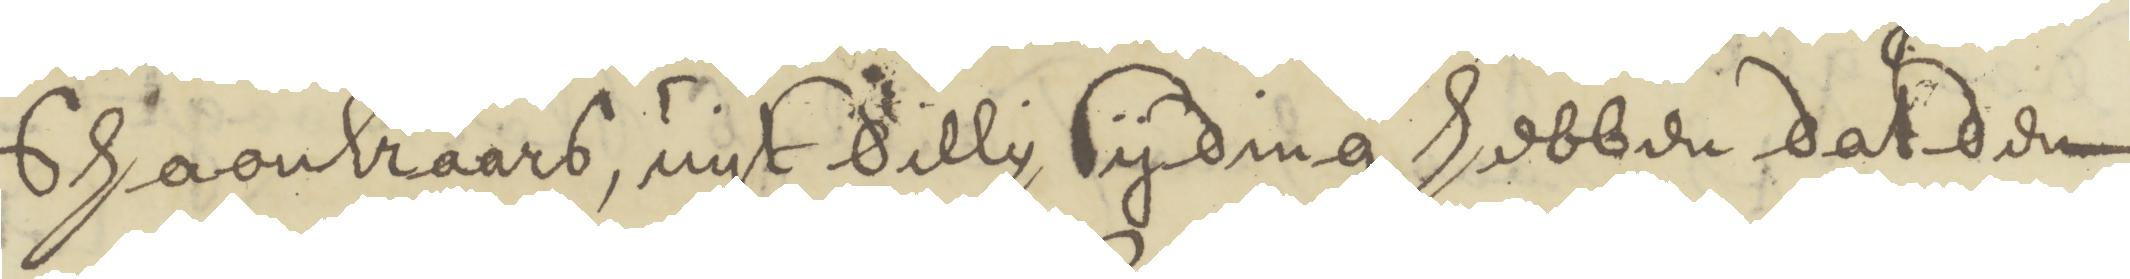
shaonkaars, uijt dillij tijding hebben dat den
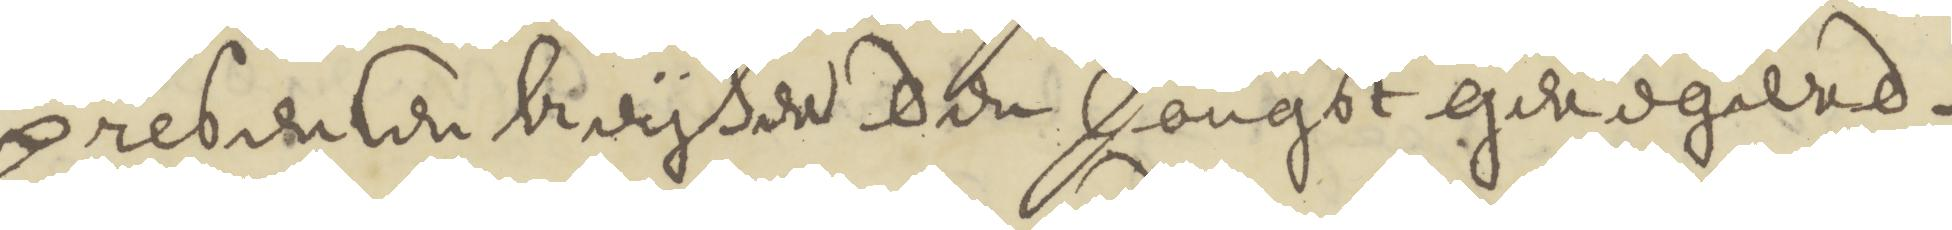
resenten keijser der Jongst geregeerd —
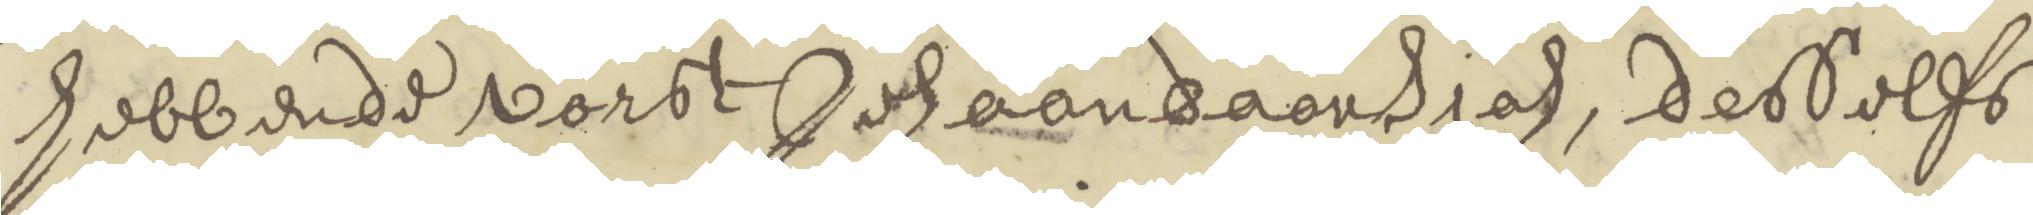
hebbende vorst Jehaandaars jas, desselfs
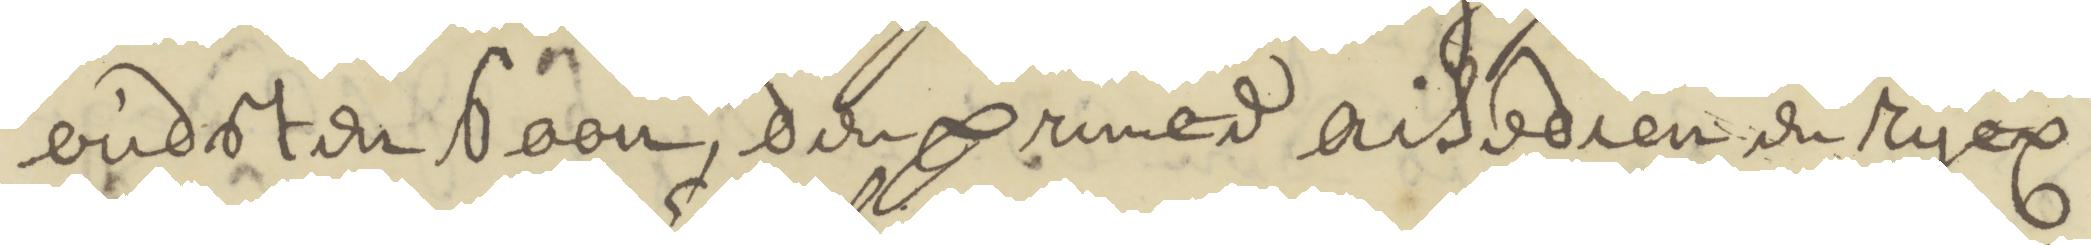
oudsten soon, den prince aisedien en rijcx
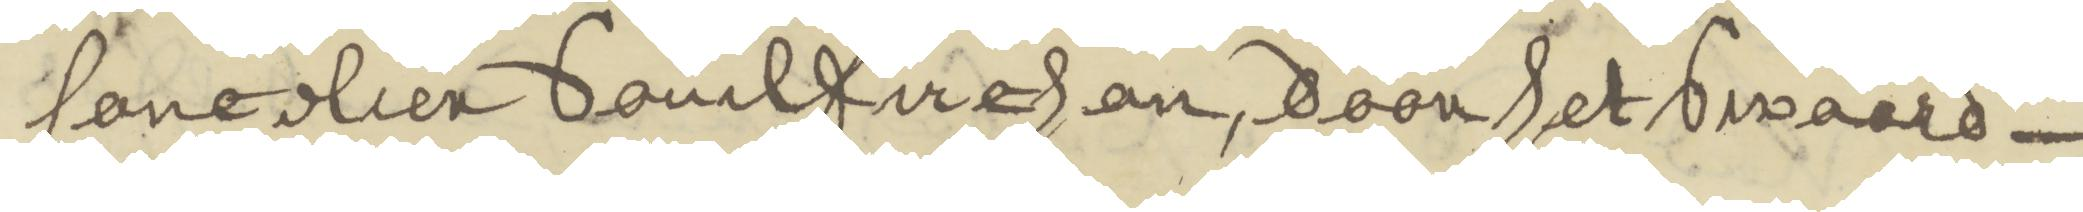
Cancelier souilfirchan, door het swaard —
